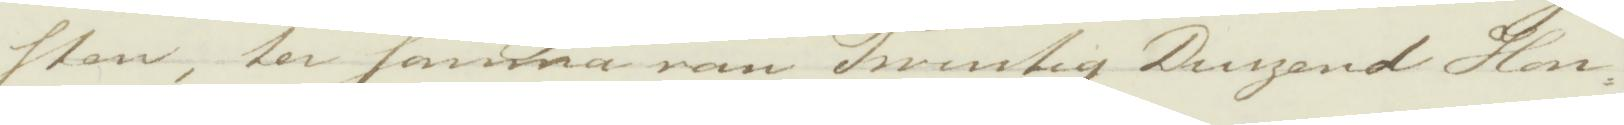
sten, ter somma van Twintig Duizend Hon„
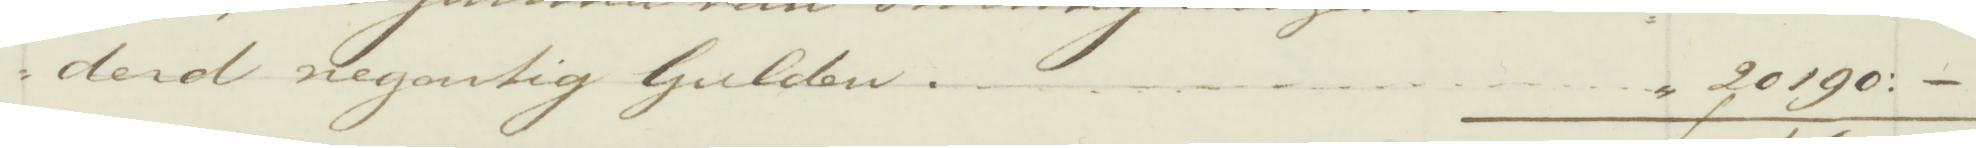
„ derd negentig Gulden . . . . . . . . . . . . . . . . . „ 20190: —
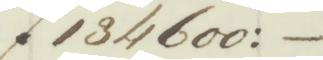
ƒ 134600: —
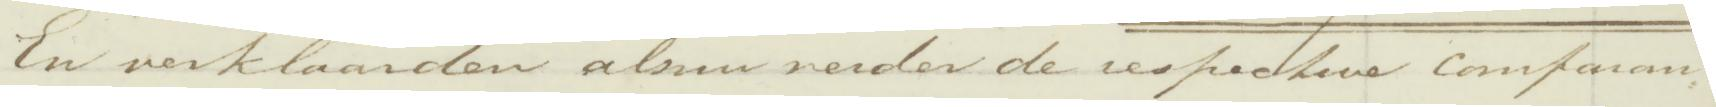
En verklaarden alsnu verder de respective comparan„
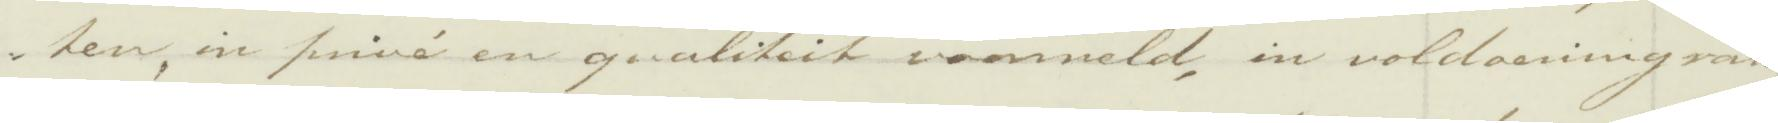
„ten, in privé en qualiteit voormeld, in voldoening van
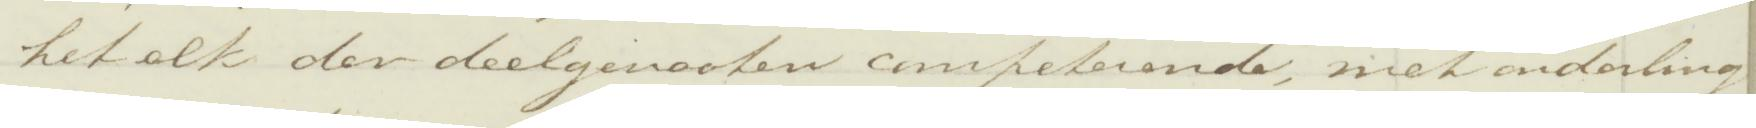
het elk der deelgenooten competerende, met onderling
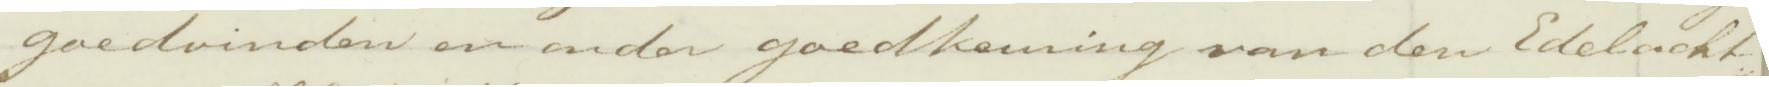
goedvinden en onder goedkeuring van den Edelacht„
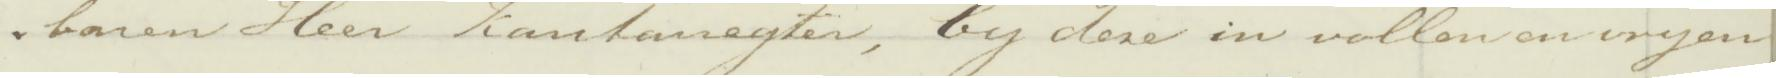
„baren Heer Kantonregter, by deze in vollen en vryen
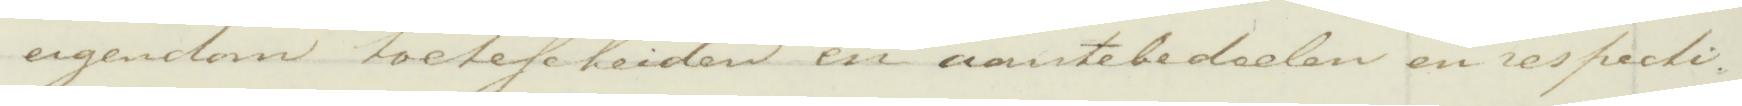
eigendom toetescheiden en aantebedeelen en respecti„
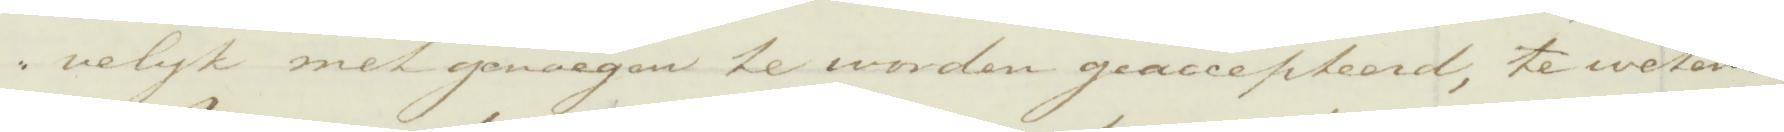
„velyk met genoegen te worden geaccepteerd, te weten:
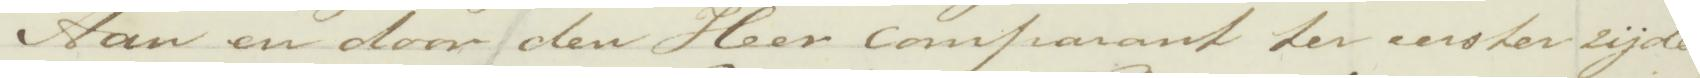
Aan en door] den Heer comparant ter eerster zijde
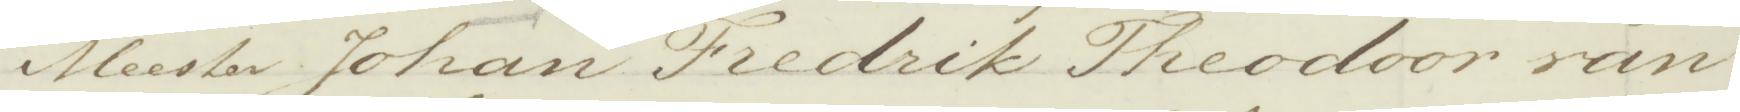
Meester Johan Fredrik Theodoor van
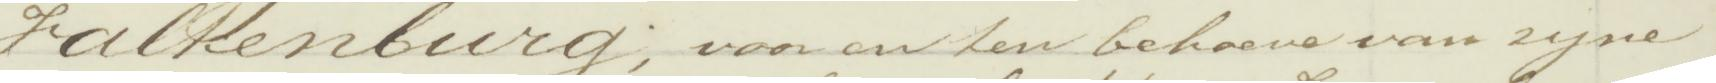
Valkenburg, voor en ten behoeve van zyne
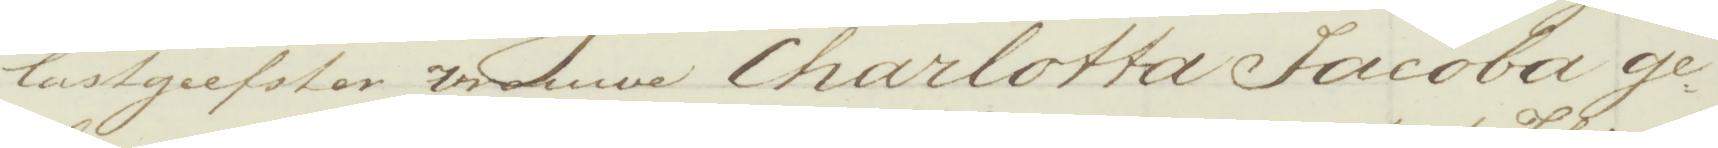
lastgeefster vrouwe Charlotta Jacoba ge„
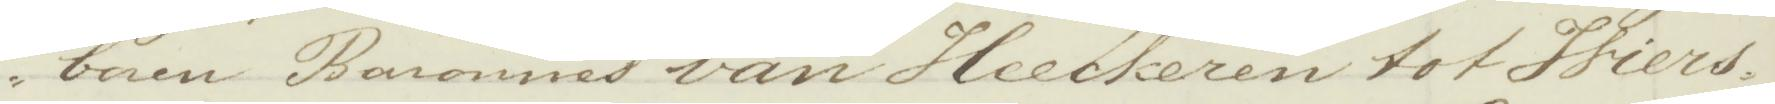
„ boren Baronnes van Heeckeren tot Wiers„
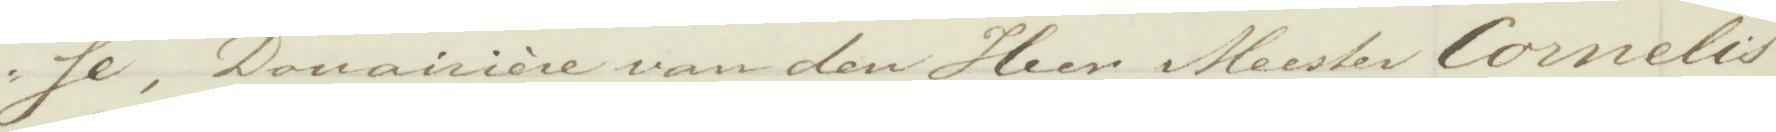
„se, Douairière van den Heer Meester Cornelis
